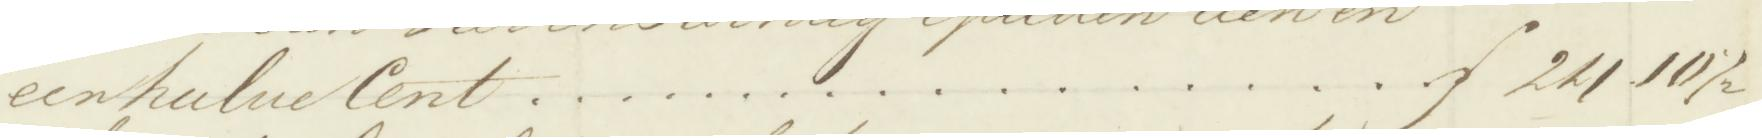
een halve Cent . . . . . . . . . . . . . . . . . ƒ 24 .10½
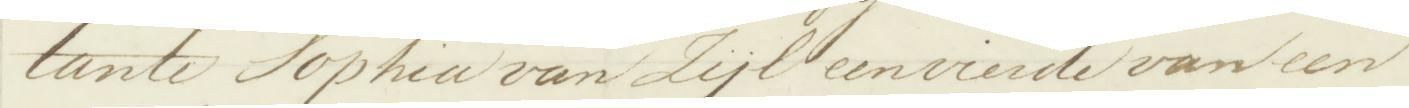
tante Sophia van Zijl een vierde van een
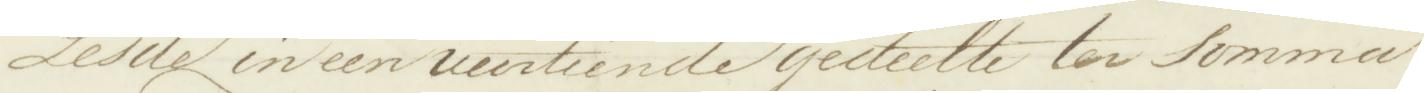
zesde in een veertiende gedeelte ter somma
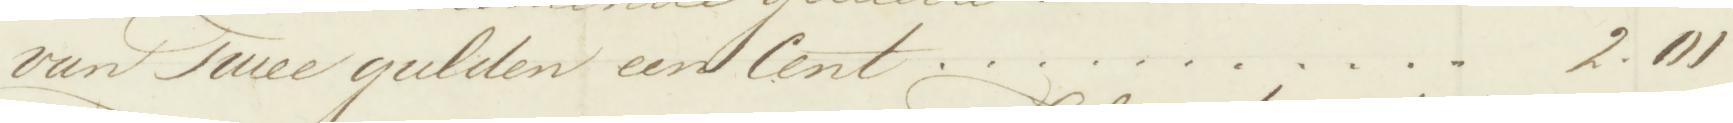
van Twee gulden een Cent . . . . . . . . . . „ 2. 01
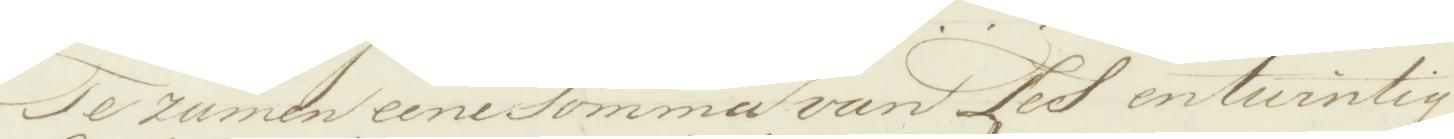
Te zamen eene somma van Zes en twintig
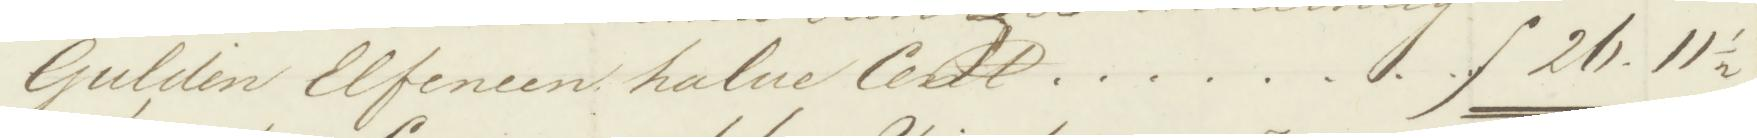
Gulden Elfen een halve Cent . . . . . . . ƒ 26. 11½
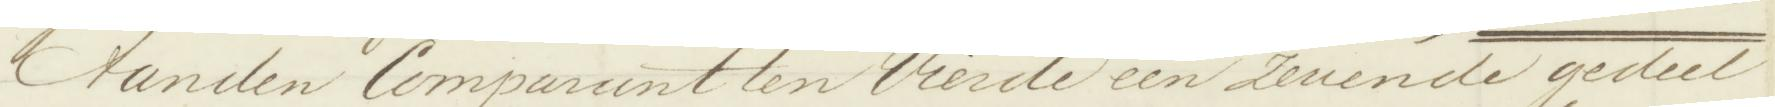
Aan den Comparant ten Vierde een zevende gedeel
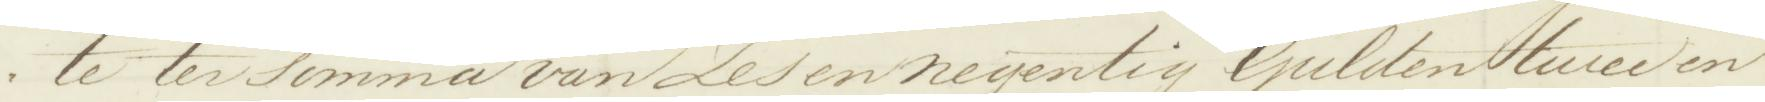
„ te ter somma van Zes en negentig Gulden twee en
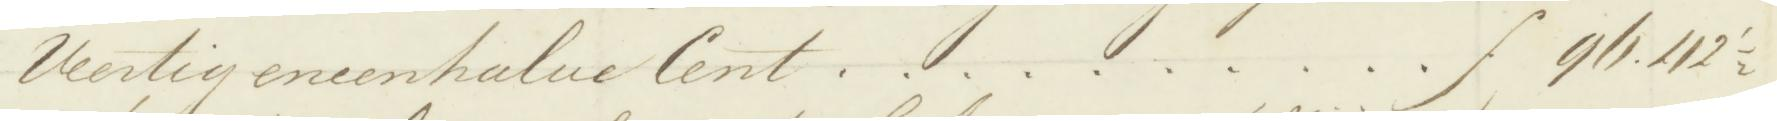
Veertig en een halve Cent . . . . . . . . . . ƒ 96.42½
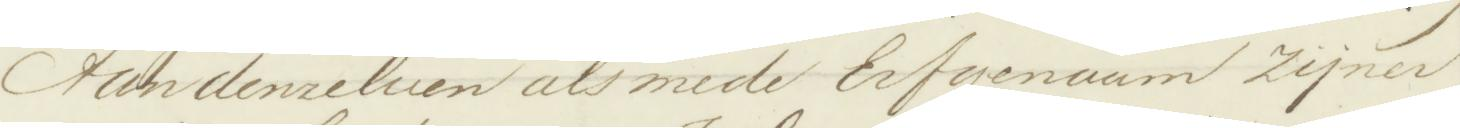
Aan denzelven als mede Erfgenaam zijner
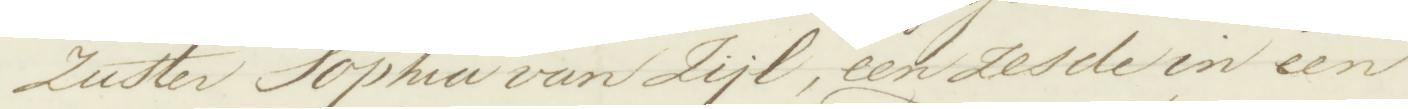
Zuster Sophia van Zijl, een zesde in een
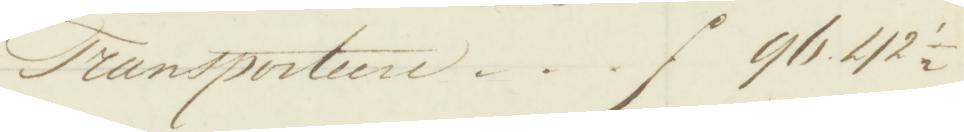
Transporteere . . . ƒ 96.42½
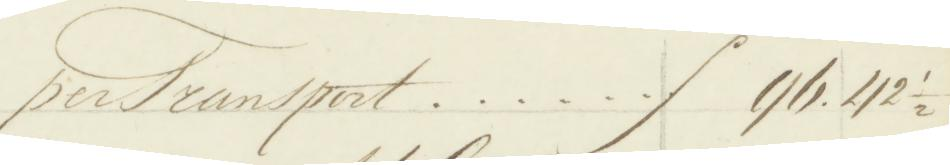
Per Transport . . . . . . ƒ 96.42½
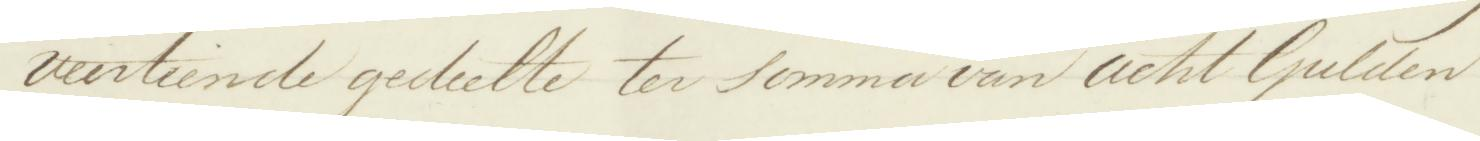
veertiende gedeelte ter somma van acht Gulden
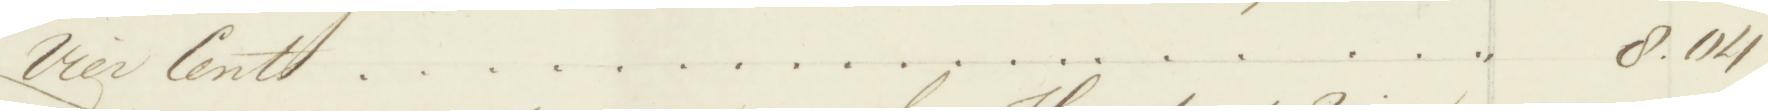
Vier Cent . . . . . . . . . . . . . . . . . . „ 8. 04
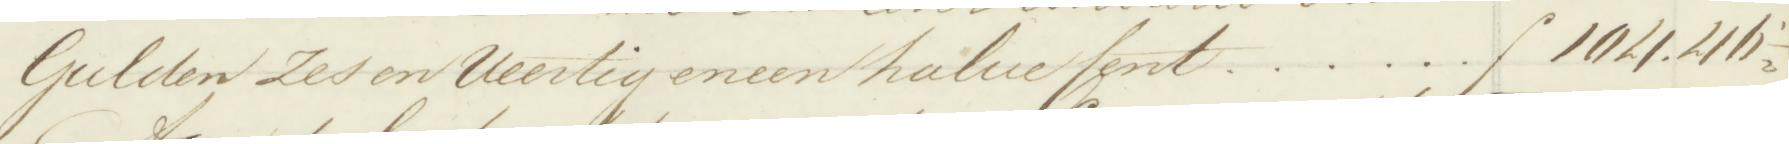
Gulden Zes en Veertig en een halve Cent . . . . . . ƒ104.46½
